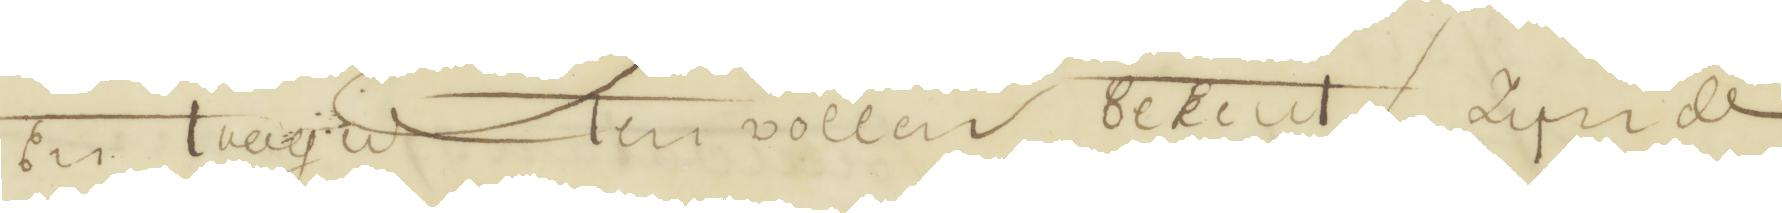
En tregie ten vollen bekent / zyn de
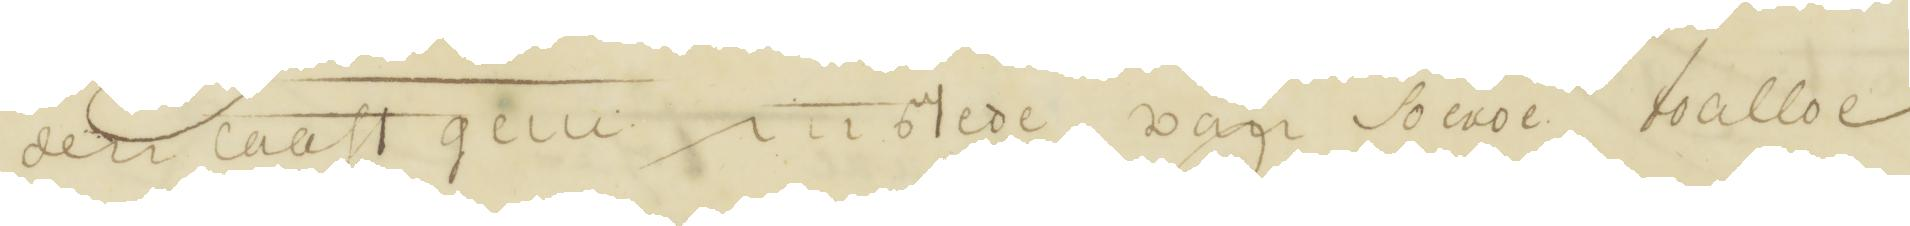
den laast gem: in stede van soeroe toalloe
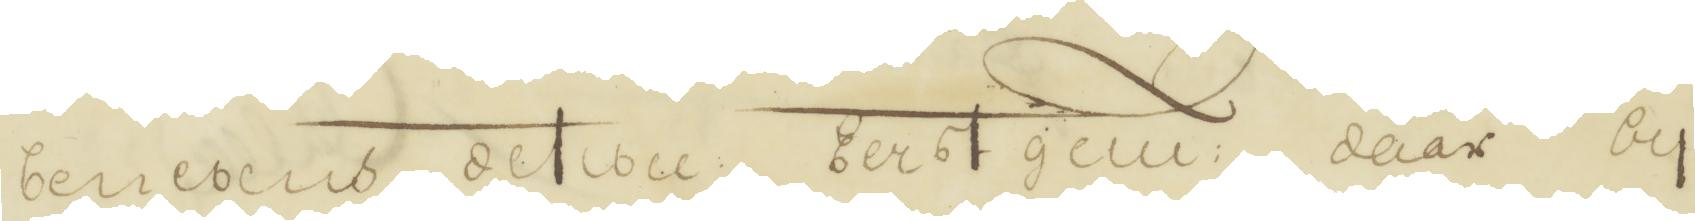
benevens detwee Eerst gem: daar by
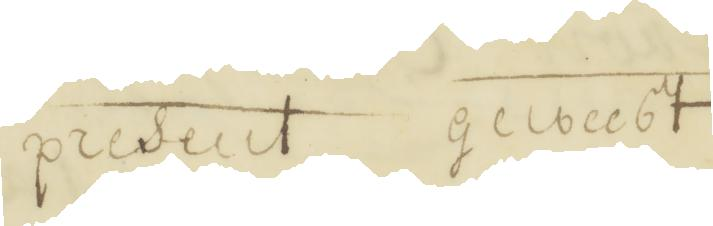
present geweest
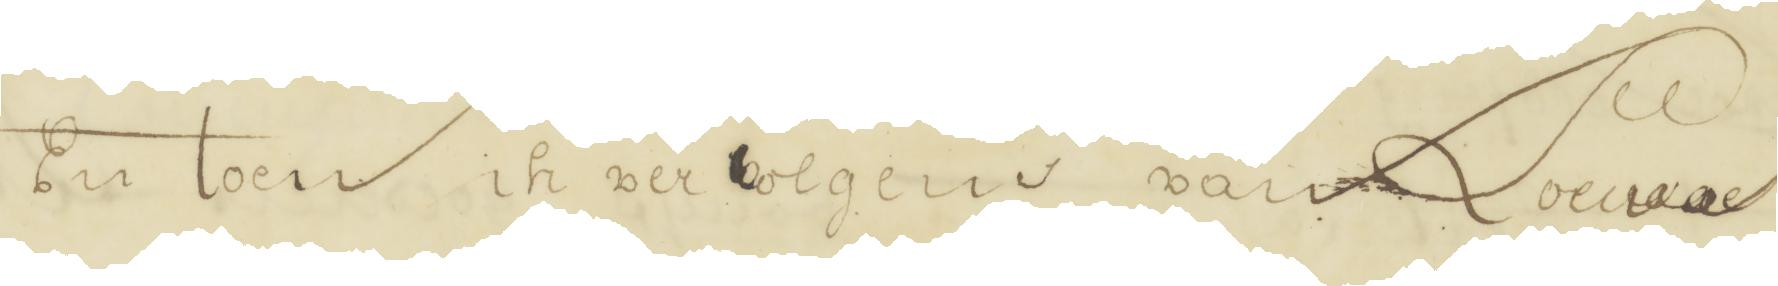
En toen ik vervolgens van Soewoe
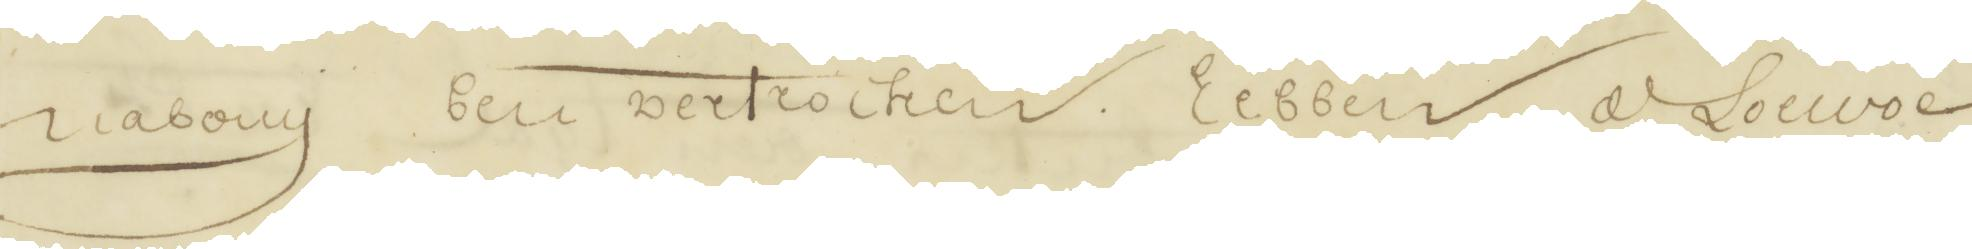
nabonij ben vertrocken. hebben de soewoe
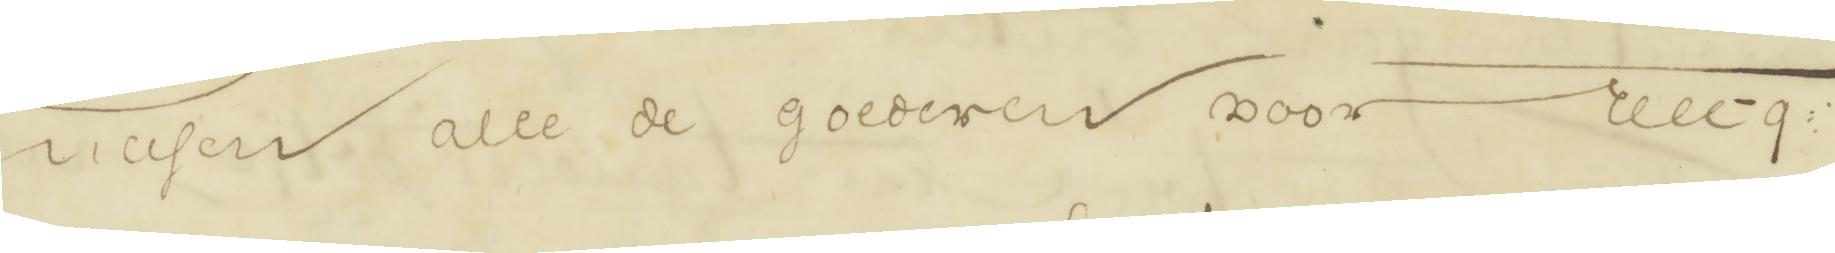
nasen alle de goederen voor reecq:
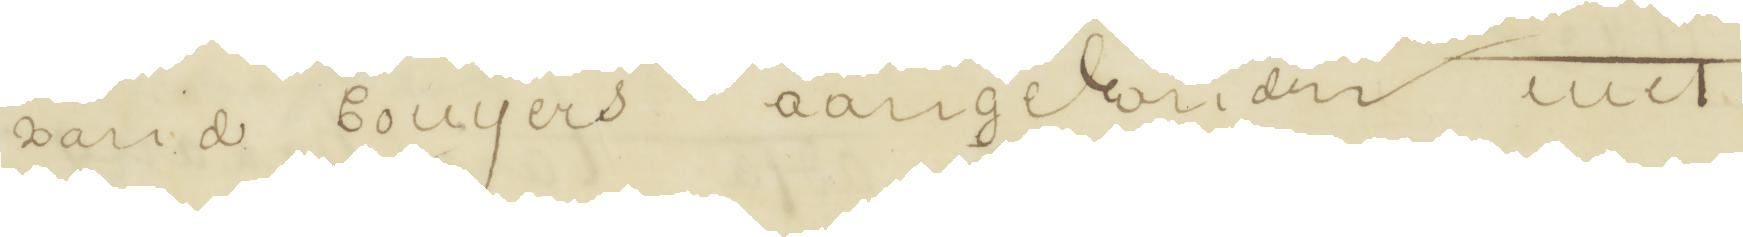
van de bonyers aangehouden met
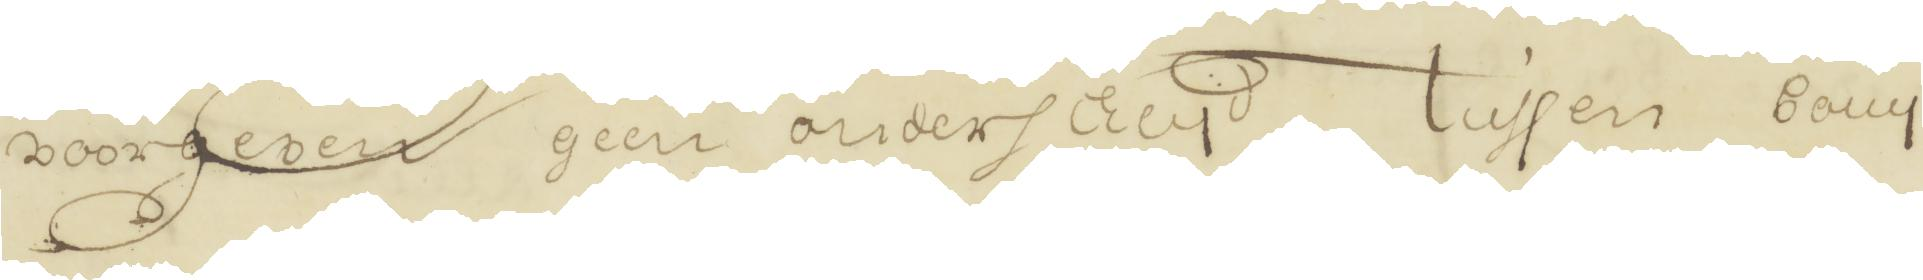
voorgeven geen onderscheijd tussen bonij
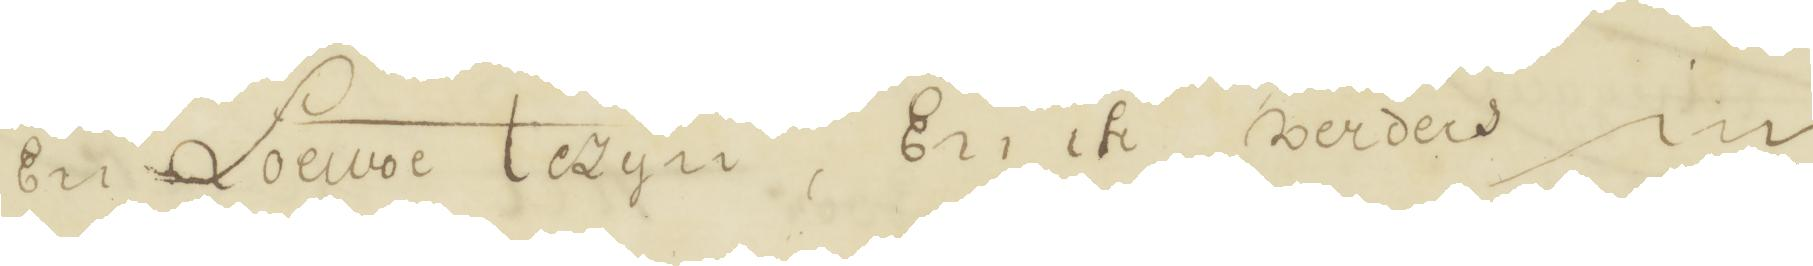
En Loewoe tezyn, En ik verders in
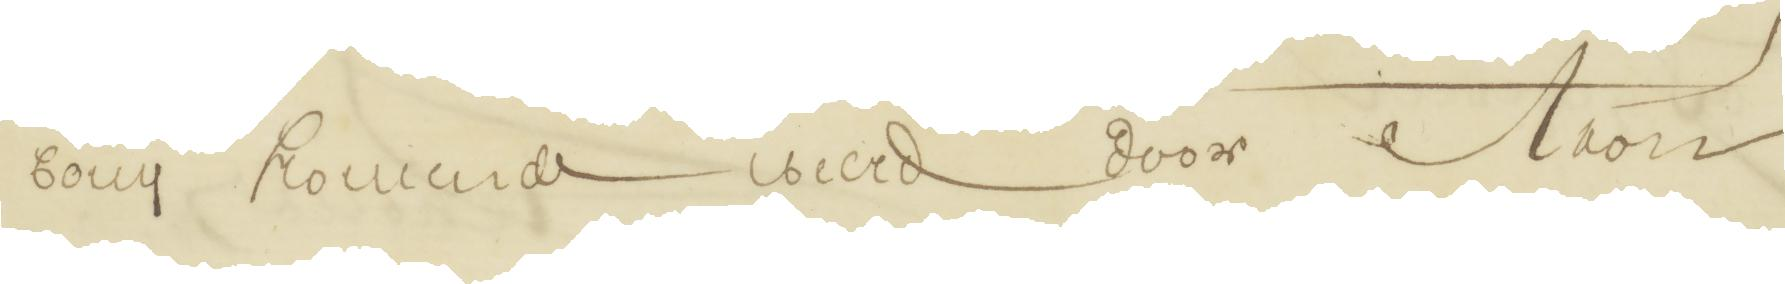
bony komende wierd door Aroe
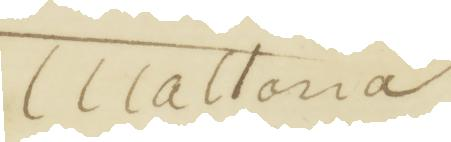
Mattoua
